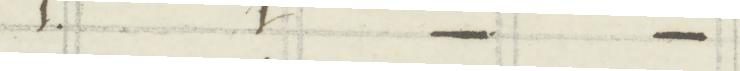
1. 1 —. —
